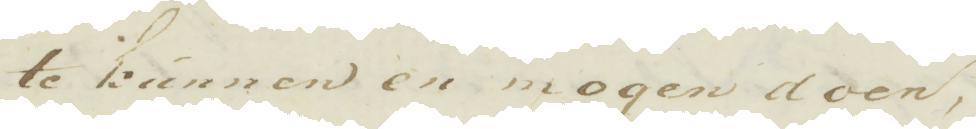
te kunnen en mogen doen,
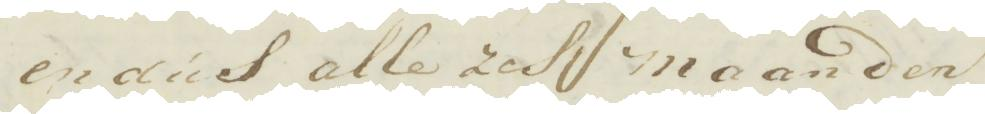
en dus alle zes maanden
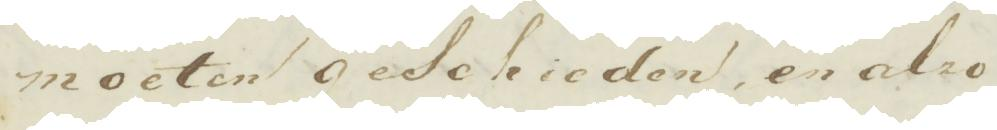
moeten geschieden, en alzo
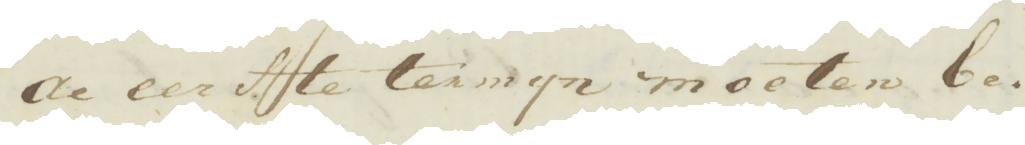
de eerste termyn moeten be„
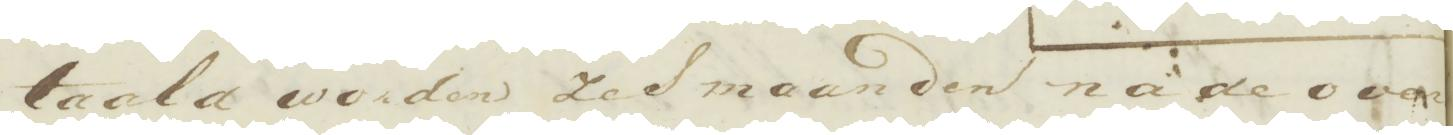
taald worden zes maanden, na de over
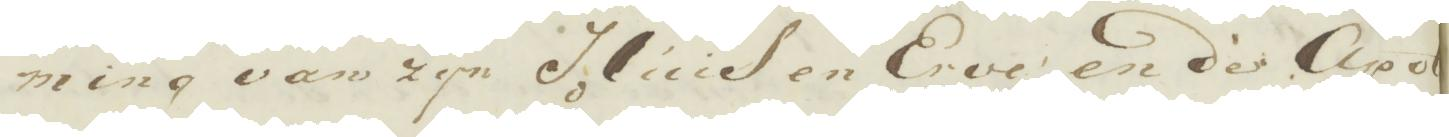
ming van zyn Huis en Erve en de Apo
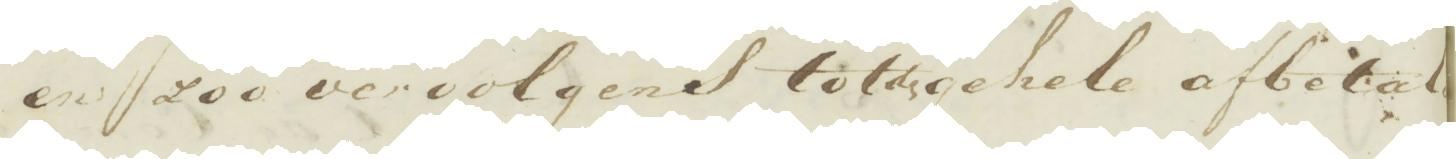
en zoo vervolgens tot de gehele afbetal
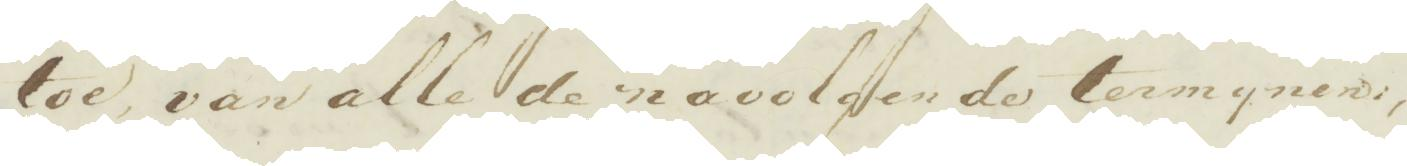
toe, van alle de navolgende termynen,
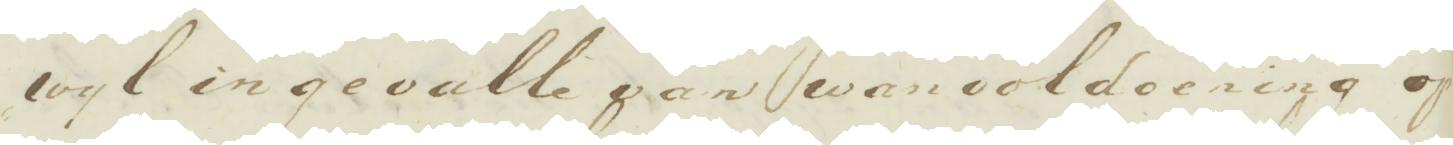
„wyl in gevalle van wanvoldoening op
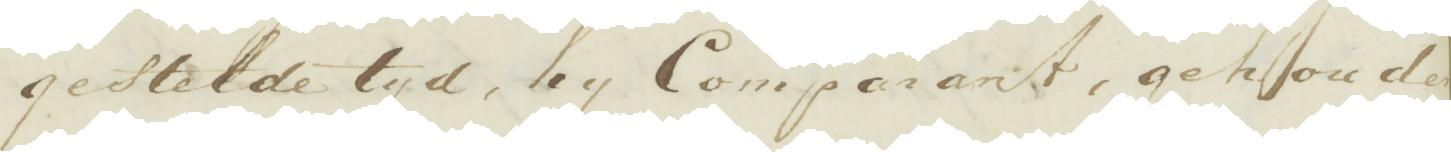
gestelde tyd, hy Comparant, gehoude
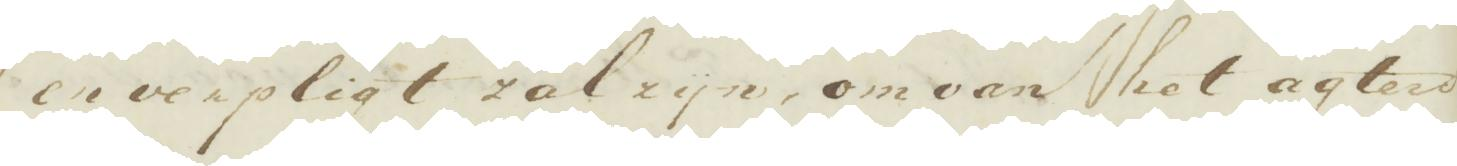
en verpligt zal zijn, om van het agters
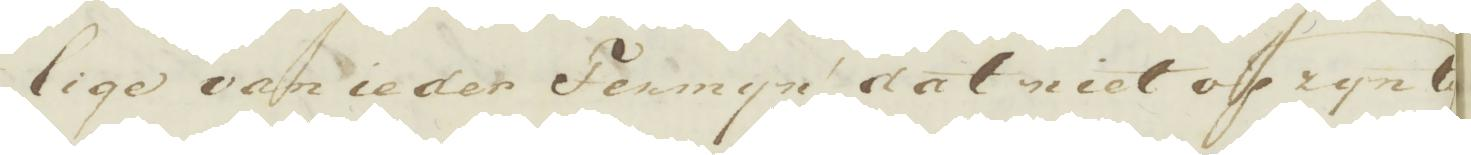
„lige van ieder Termyn dat niet op zyn tij
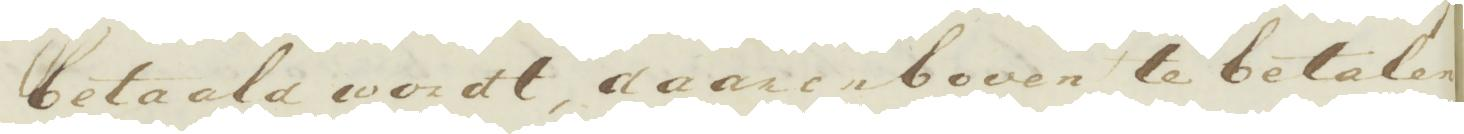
betaald wordt, daar en boven te betalen
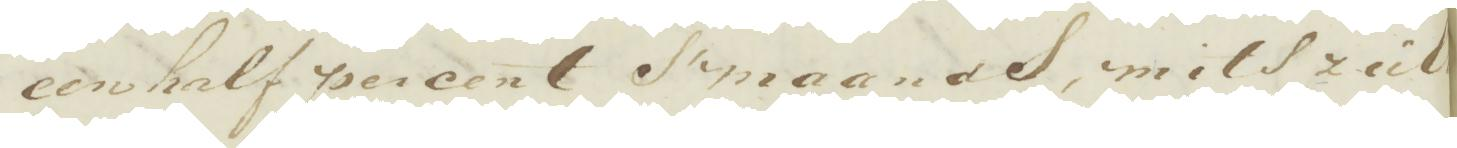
een half percent s'maands, mits zul
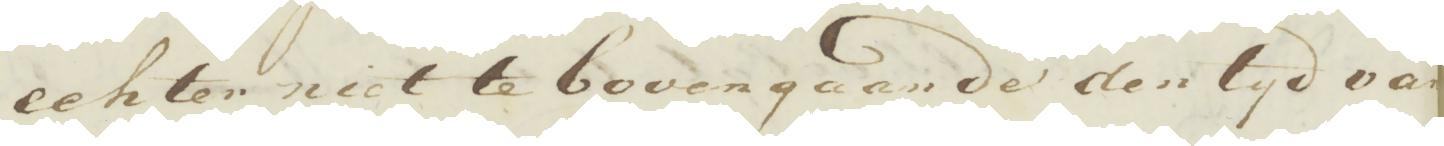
echter niet te bovengaande den tyd van
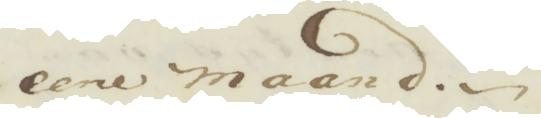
eene maanden.
